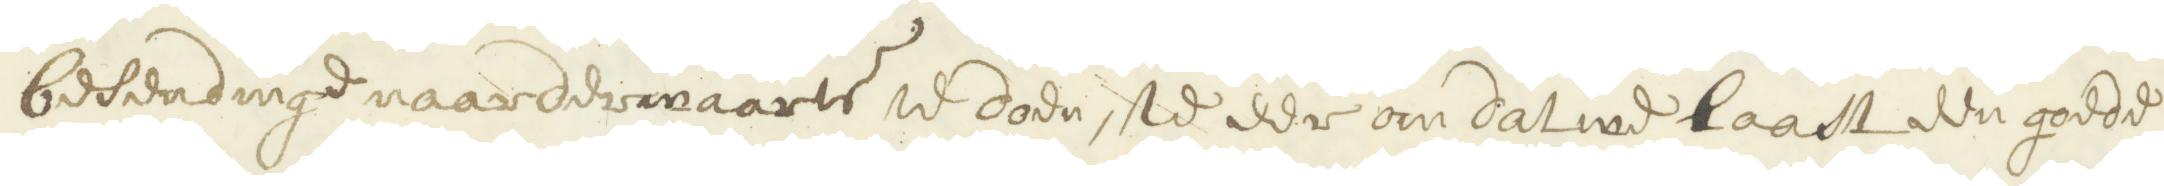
besendinge naar derwaarts te doen, te eer om dat we laast een goede
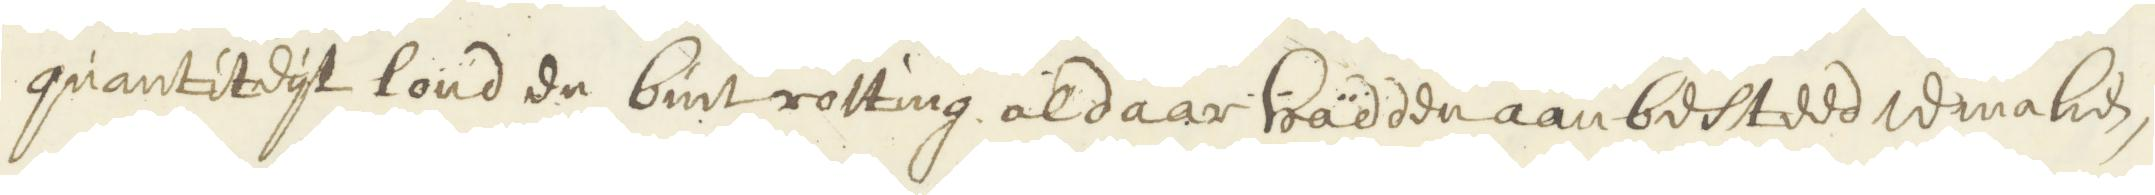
quantiteijt lond en bintrotting aldaar hadden aanbesteed te maken,
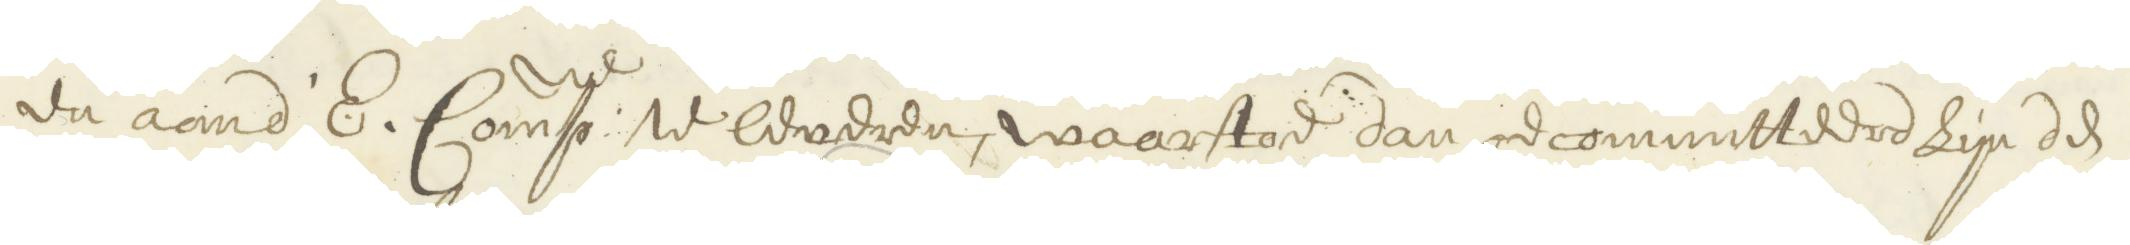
en aan d’ E. Comp:e te leveren, waartoe dan gecommitteerd zijn den
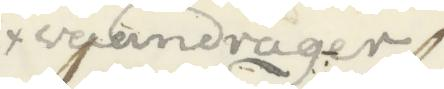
x vaandrager
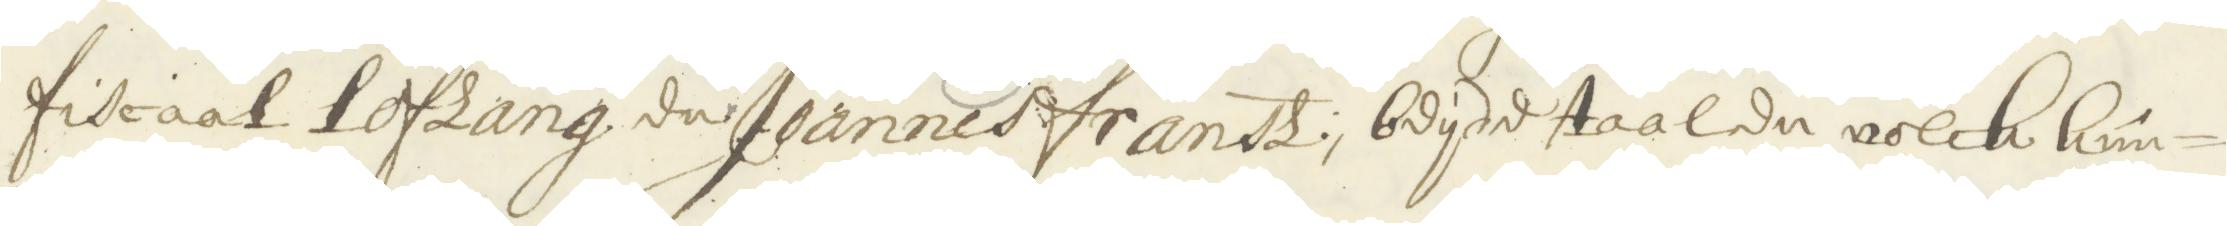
fiscaal Lofzang en x Joannes fransz:, beijde taalen volck kun=
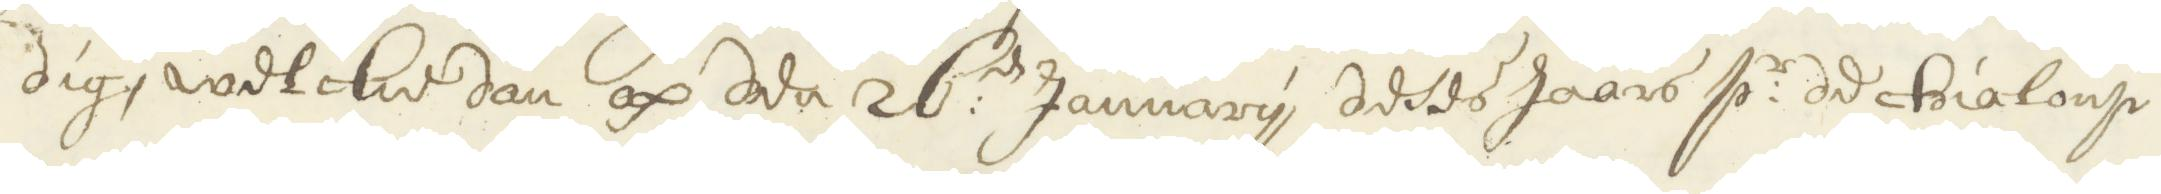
dig, welcke dan op den 26:en Januarij deses Jaars p:r de chialoup
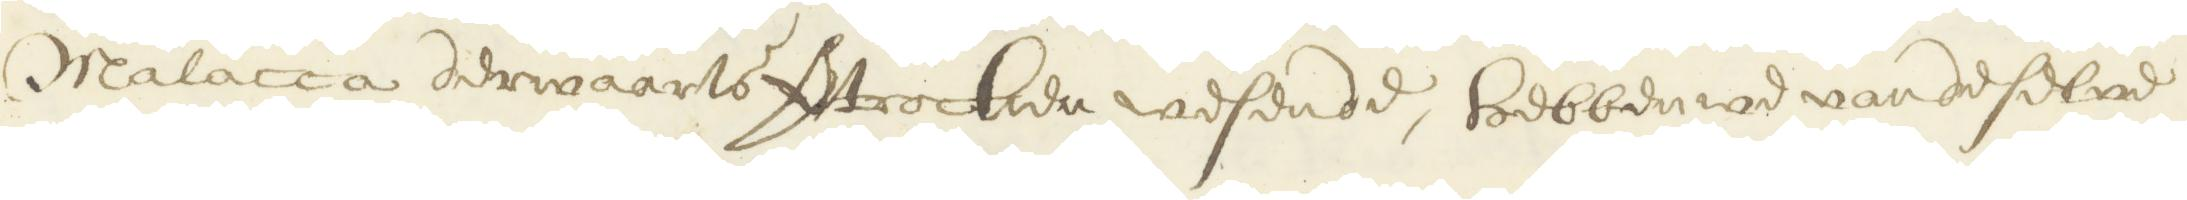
Malacca derwaarts vertrocken wesende, hebben we van deselve
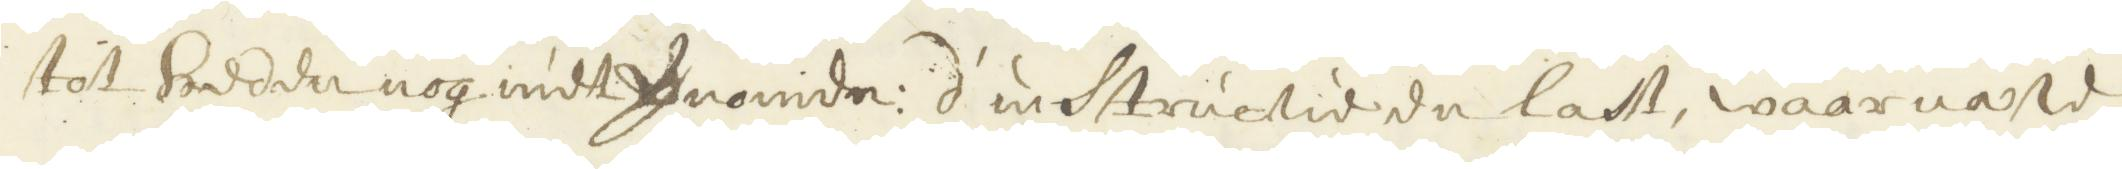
tot heden nog niet vernomen: d’ instructie en last, waar na te
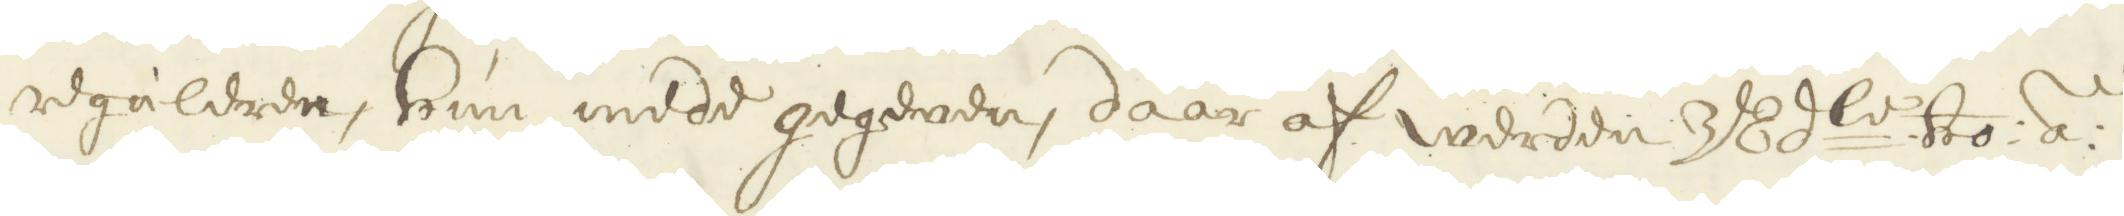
reguleren, hun mede gegeven, daar af werden VEd=le ho: a:
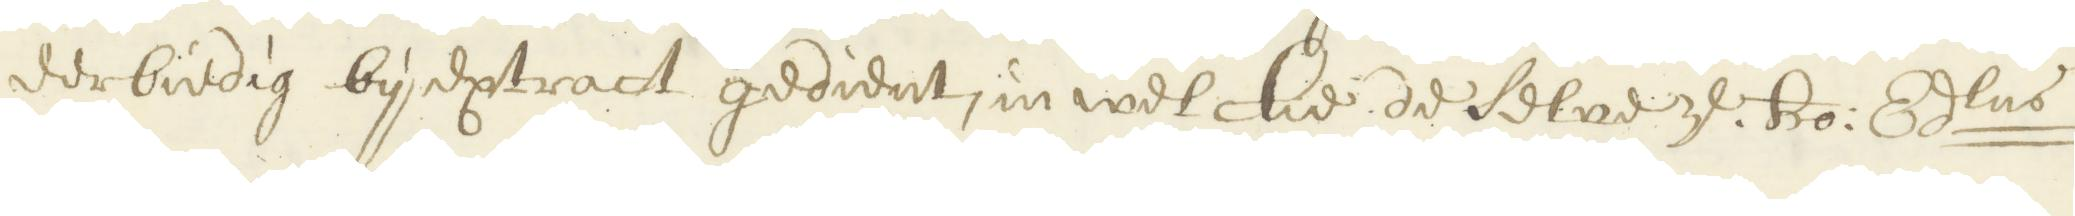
eerbiedig bij extract gedient, in welcke de selve V. Ho: Ed=lns
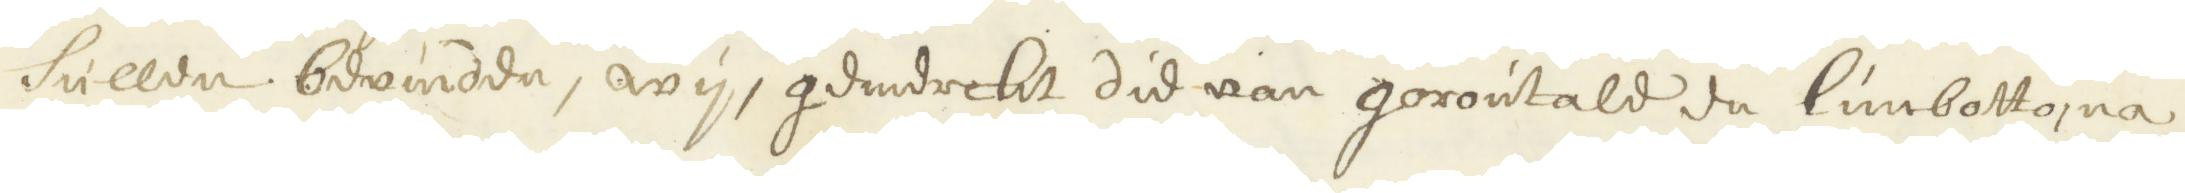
sullen bevinden, wij, gemerckt die van gorontale en limbotto, na
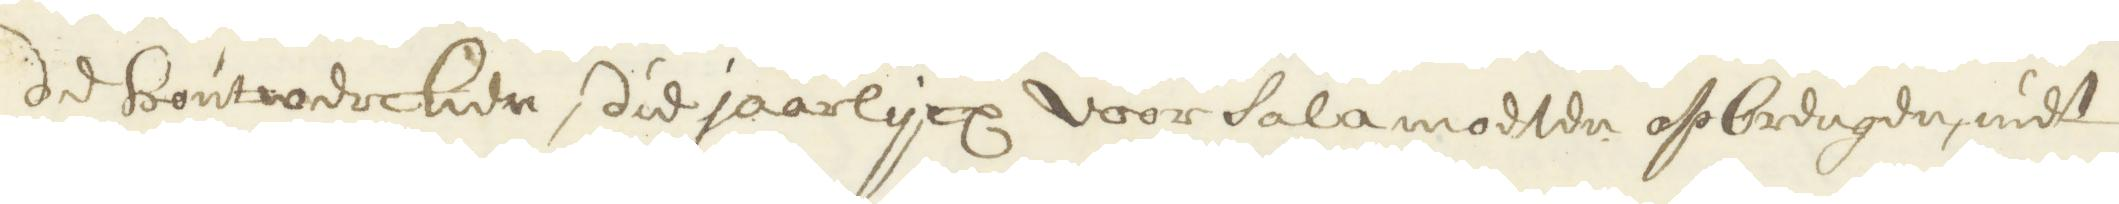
de houtwercken, die jaarlijcx voor sala moeten op brengen, niet
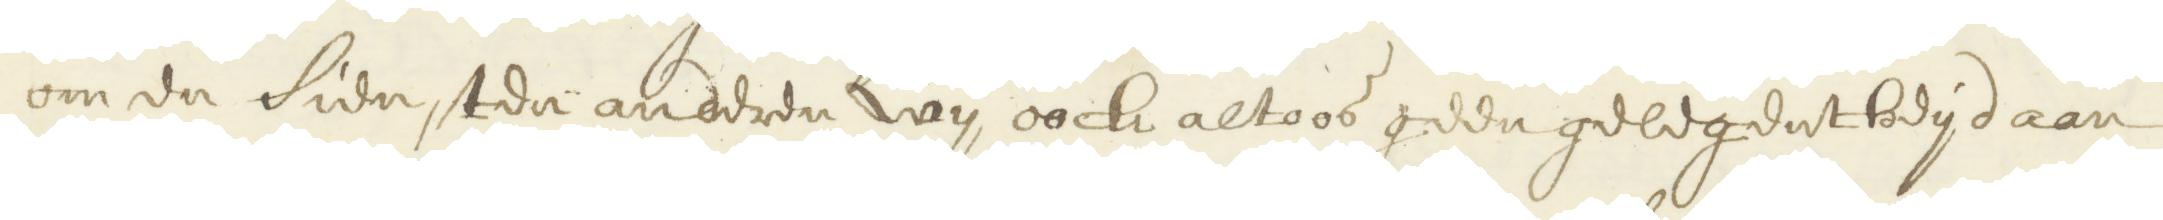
om en sien, ten anderen wij oock altoos geen gelegentheijd aan
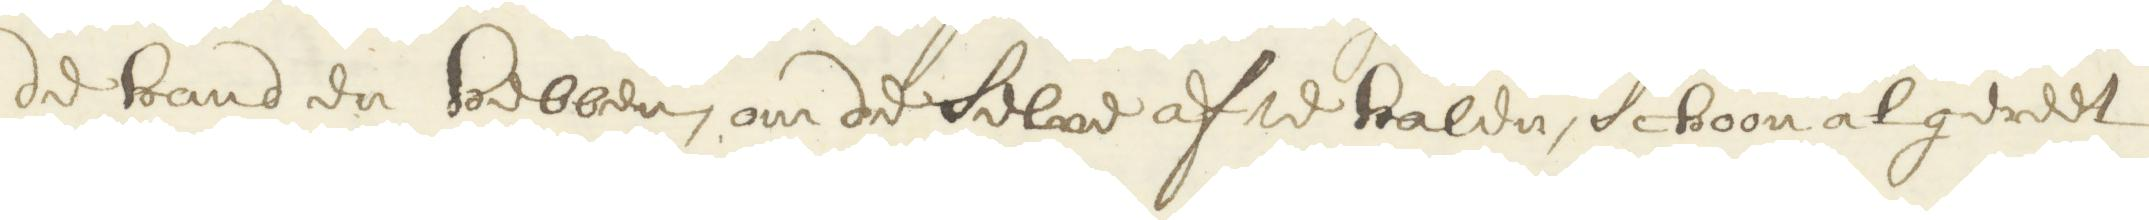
de hand en hebben, om de selve af te halen, schoon al gereet
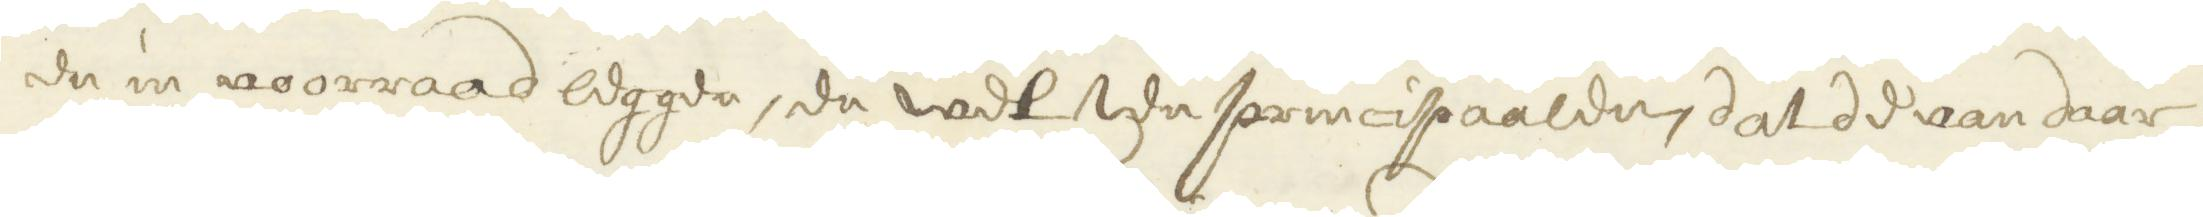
en in voorraad leggen, en wel ten principaalen, dat de aan daar
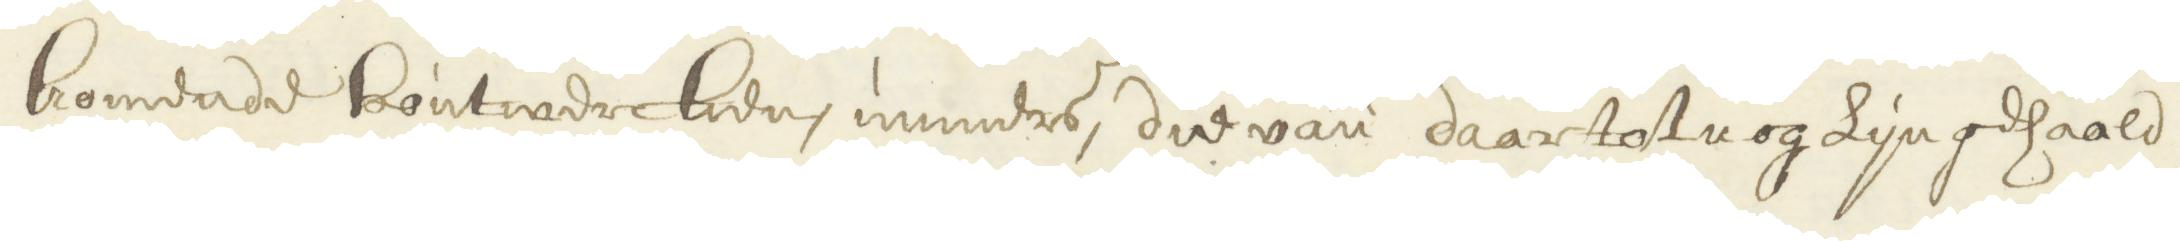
komende houtwercken, immers, die van daar tot nog zijn gehaald
